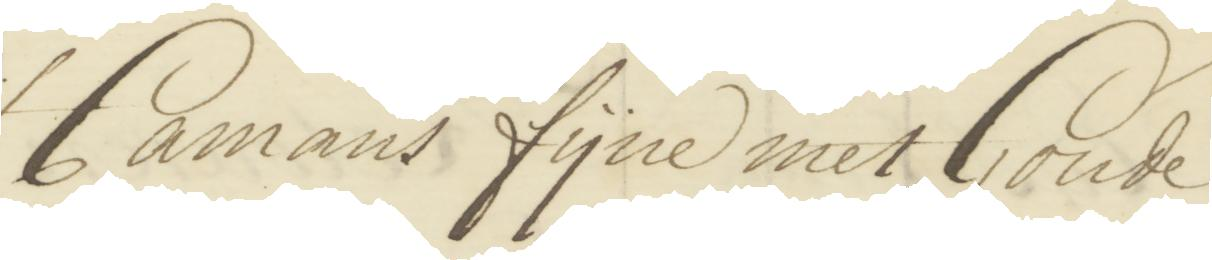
Hamans fijne met Goude
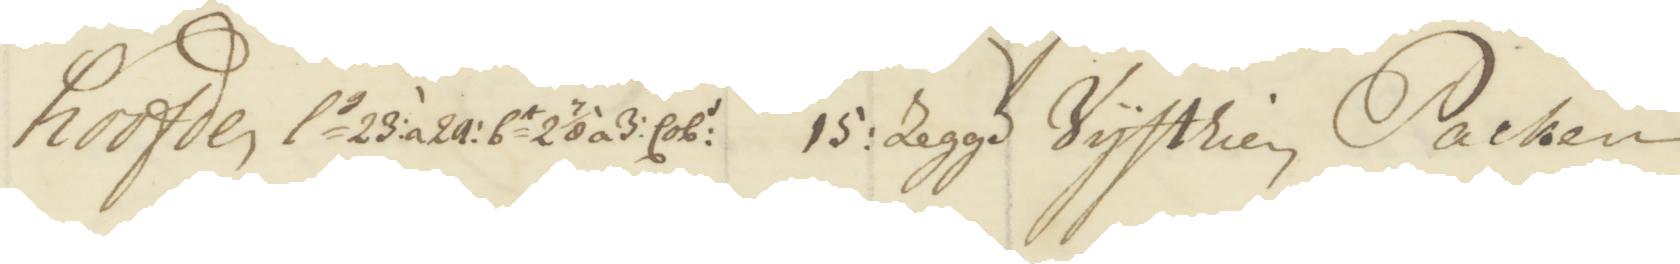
hoofden l=g 23: à 24: b=t 2 7/8 à 3: Col:s 15: zegge Vijfthien Packen
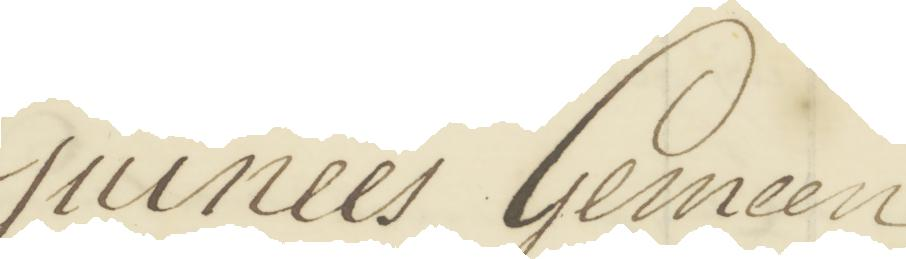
Guinees Gemeen
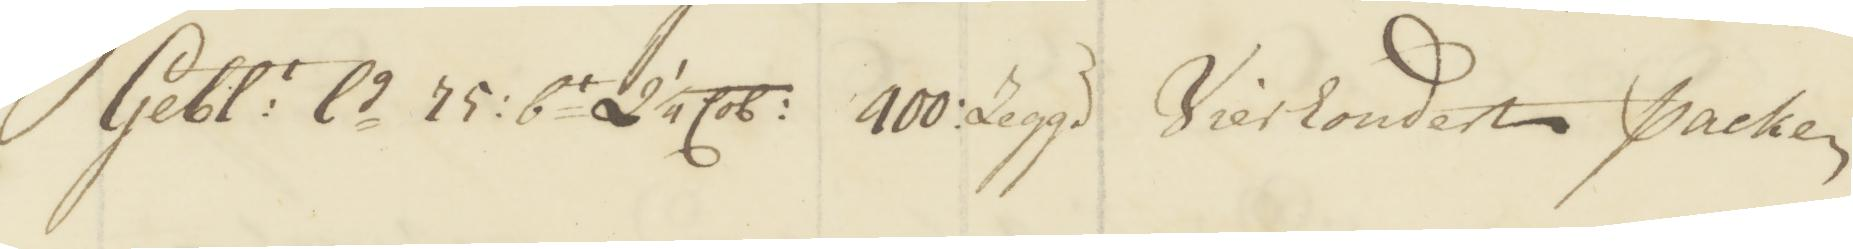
Gebl:t l=g 75: b=t 2¼ Col: 400: zegge Vierhondert packen
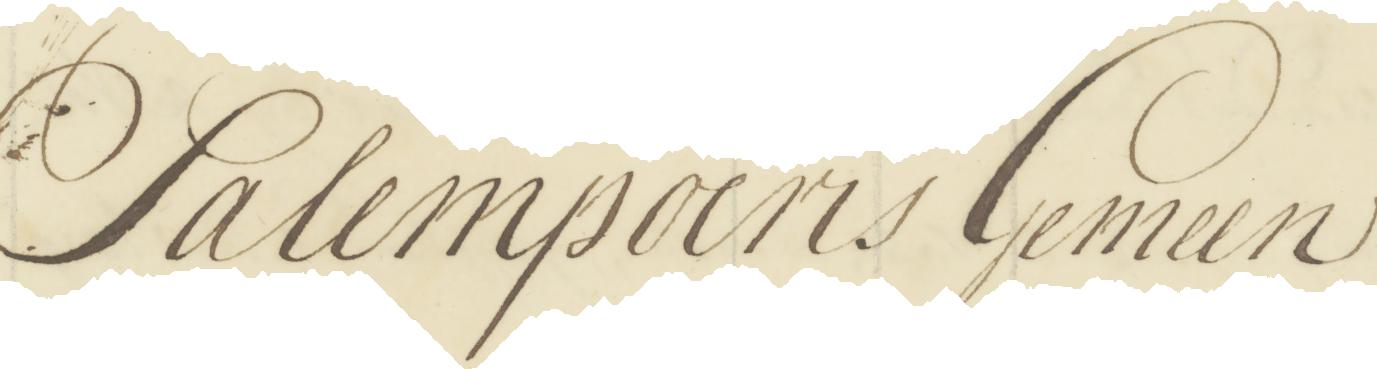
Salempoeris Gemeen
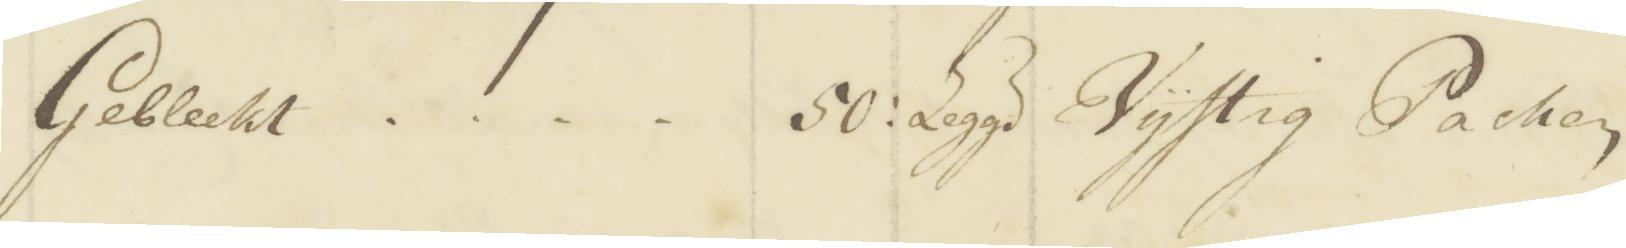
Gebleekt . . . . 50: zegge Vijftig Packen
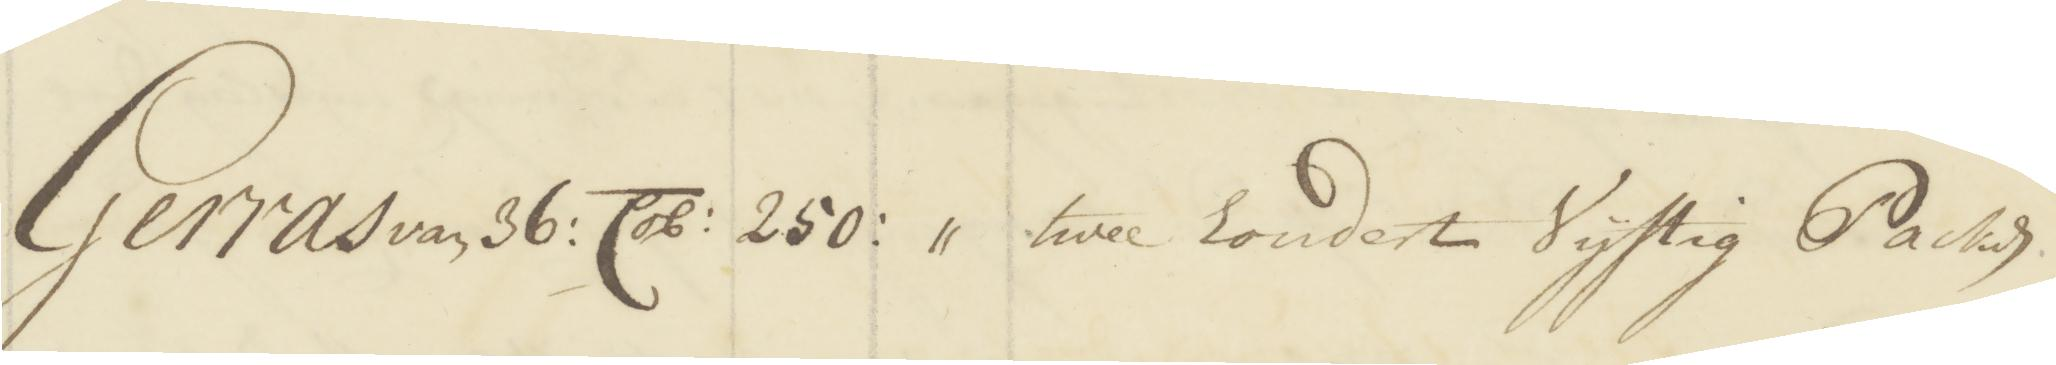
Gerras van 36: Col: 250: twee hondert Vijftig Packen
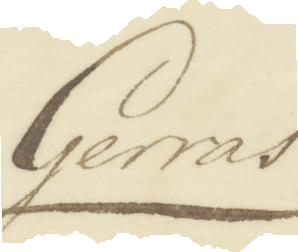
Gerras
